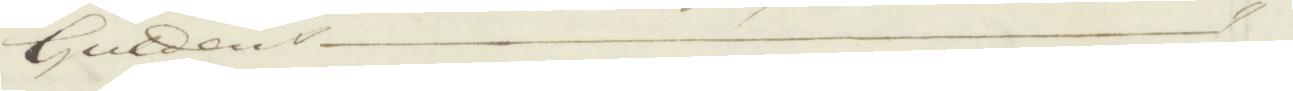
Guldens—
